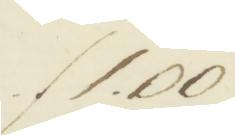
„ gen . . . . ƒ1.00
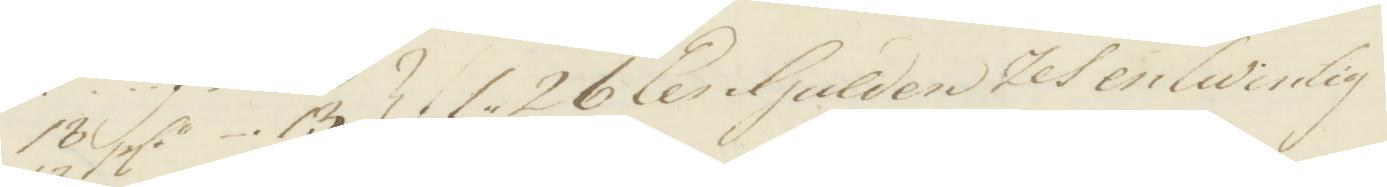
18 pC.t – . 13 ƒ1„26 Een Gulden zes en twintig
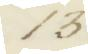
13 – . 13
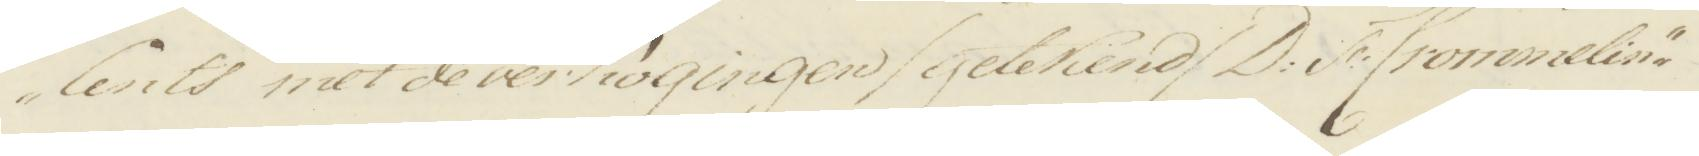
„ Cents met de verhogingen /getekend/ D: F: Crommelin„"
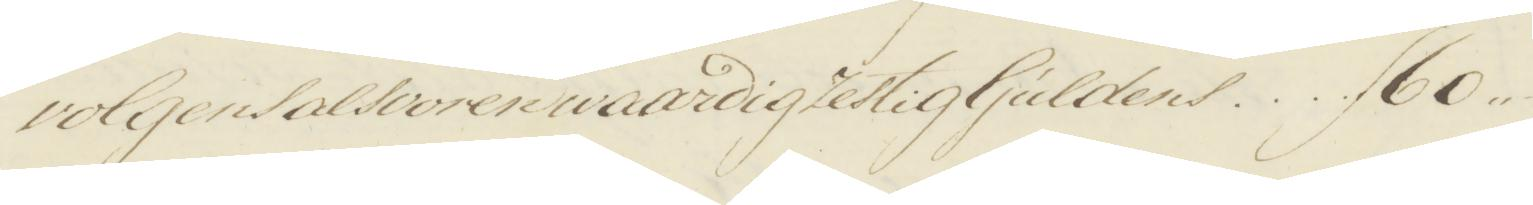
volgens als voren waardig zestig Guldens . . . . ƒ60 „ —
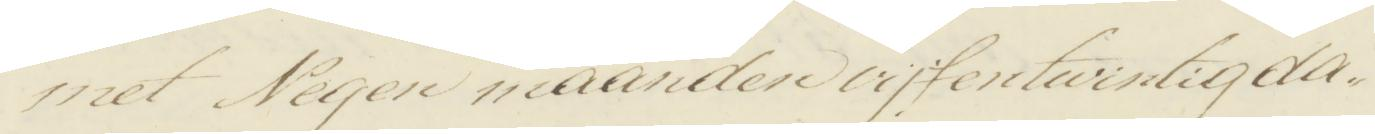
met Negen maanden vijfentwintig da„
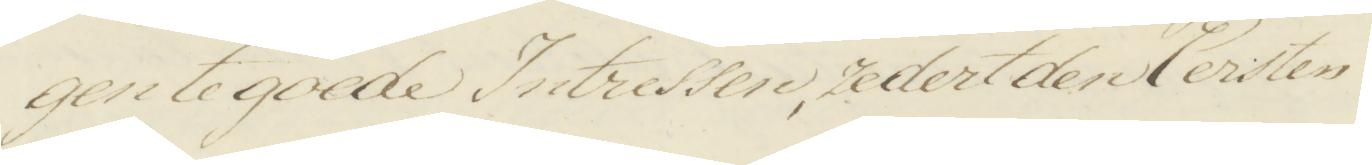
gen te goede Intressen, zedert den Eersten
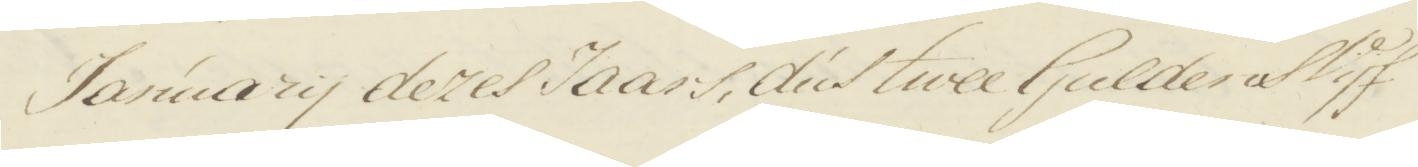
Ianuarij dezes Iaars, dus twee Guldens Vijf
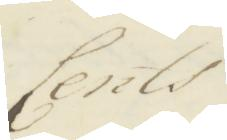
Cents . . . . . . . . . . . . „ 2„ 05„62„05
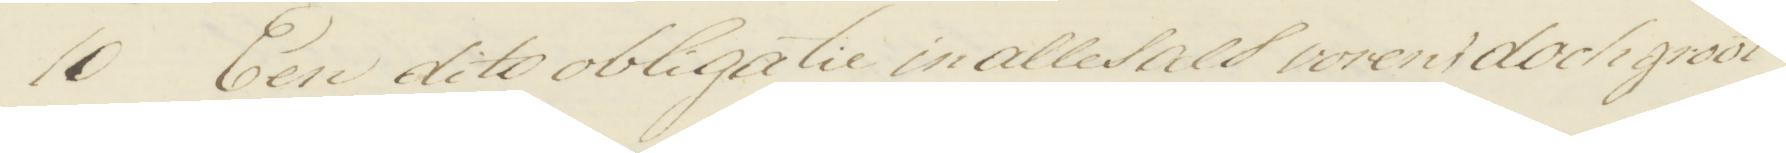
10 Een dito obligatie in alles als voren doch groot
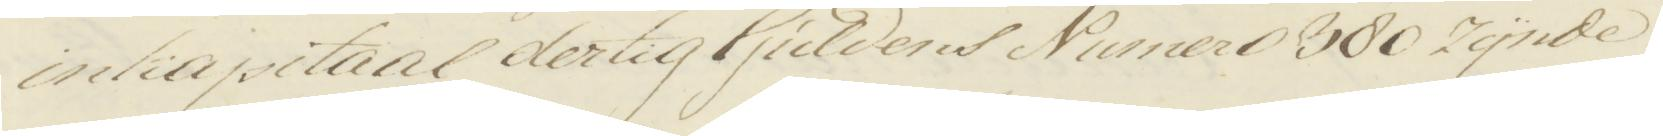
in kapitaal dertig Guldens Numero 380 zijnde
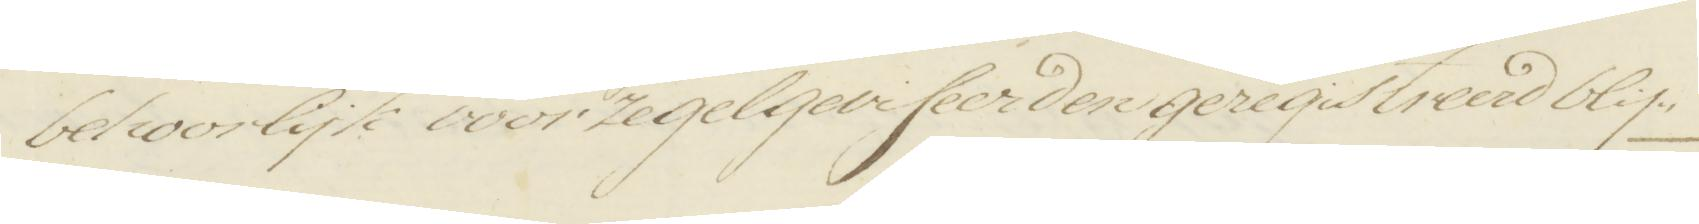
behoorlijk voor zegel geviseerd en geregistreerd blij„
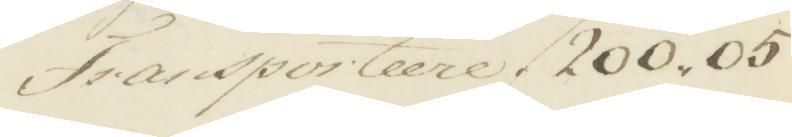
Transporteere ƒ200„05
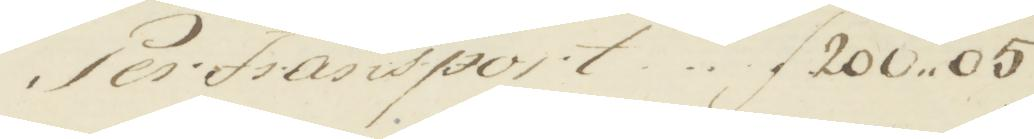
Per Transport . . . . ƒ200„05
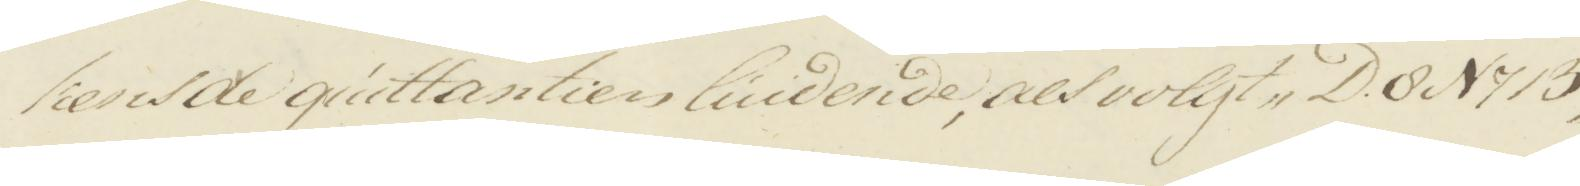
kens de quittantien luidende, als volgt „ D.8 N713
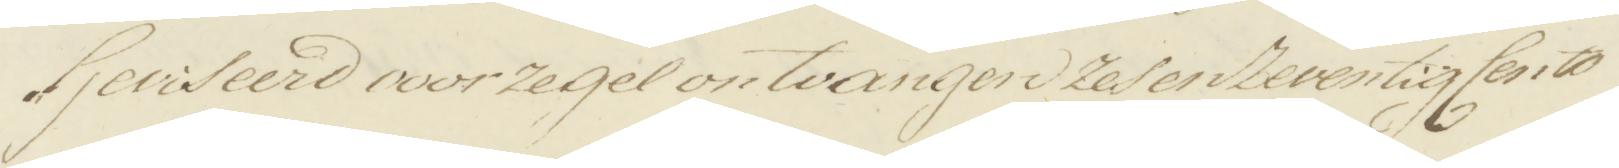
„ Geviseerd door zegel ontvangen zes en zeventig Cents
